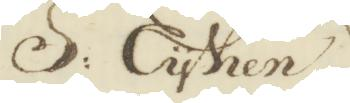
J: Eijken
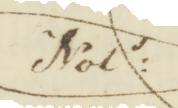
Not:s
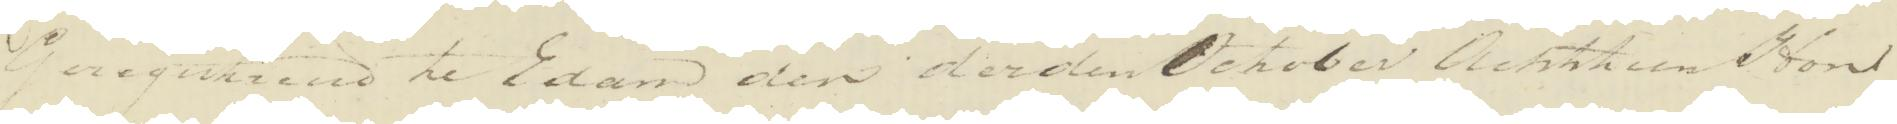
Geregistreerd te Edam den derden October Achttien Hon
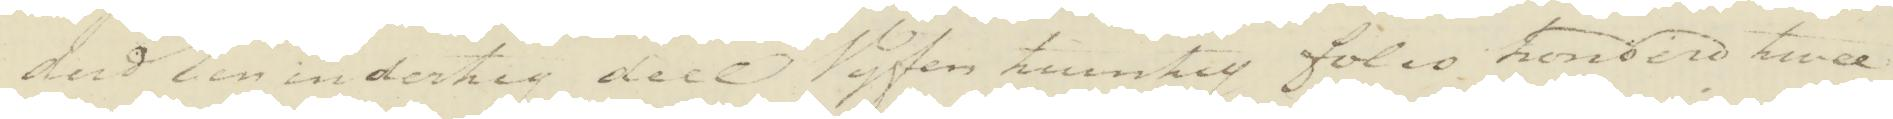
derd Een in dertig deel Vyfen twintig folio honderd twee
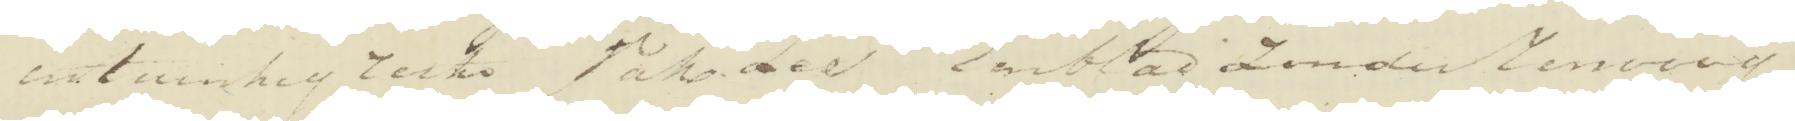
entwintig recto Vak Zes Een blad zonder renvooy
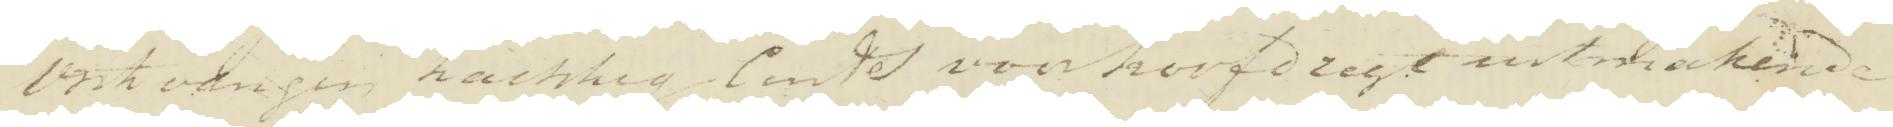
Ontvangen tachtig Cents van hoofdregt uitmakende
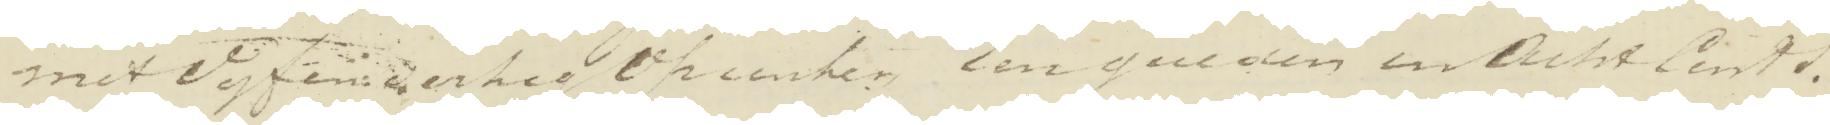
met Vyfendertig Opcenten Een gulden en Acht Cents.
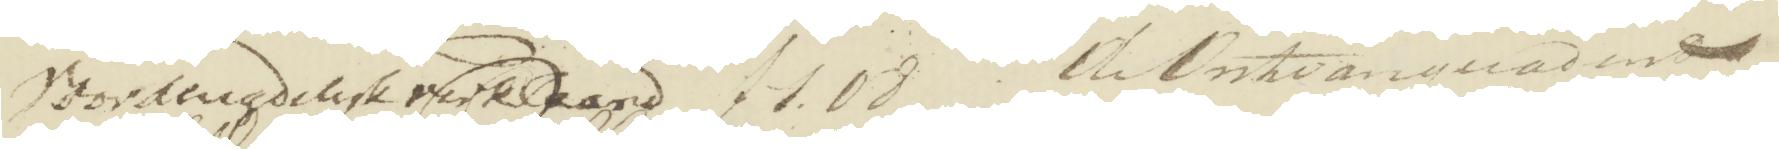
Voordeugdelyk verklaard ƒ1.08 de ontvanger ad ind
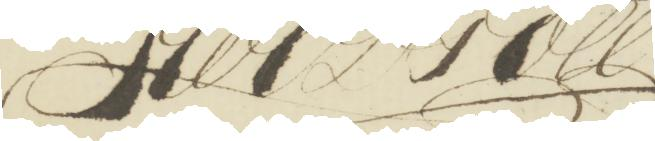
JWVD Poll
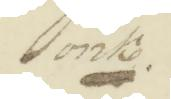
Vonk.
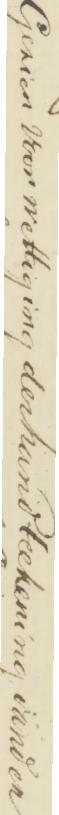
Gezien voor wettiging derhand teekening vanden
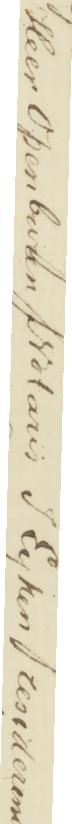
Heer Openbaar Notaris J Eyken residerende
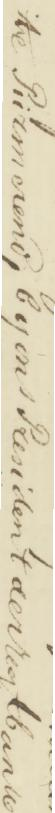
te Purmerend, by ons Resident der regtbank
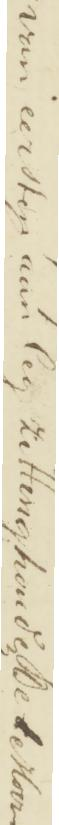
van eersten aanleg zitting houdende te Hoorn
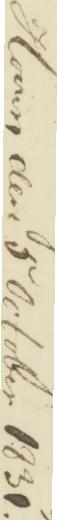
Hoorn den 5 October 1831.
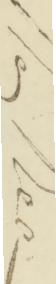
den Heer
